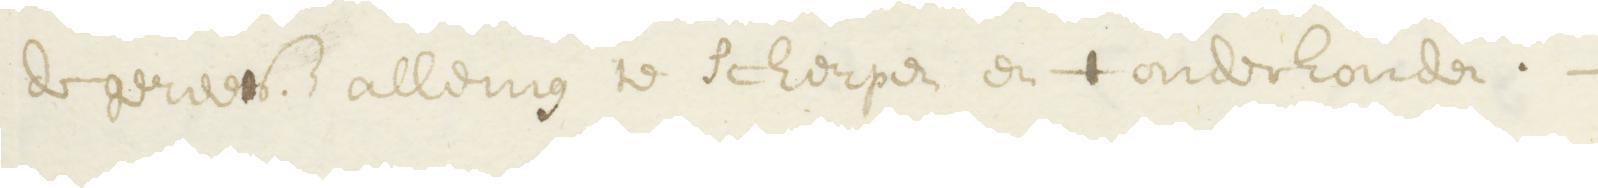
de gereets. allenig te scherpen en t onderhouden.
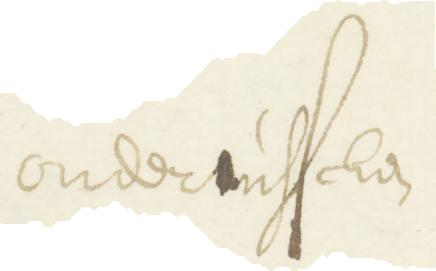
ondertusschen
